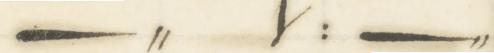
— „ 1: —„
